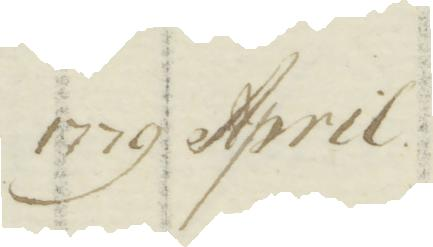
1779 April:
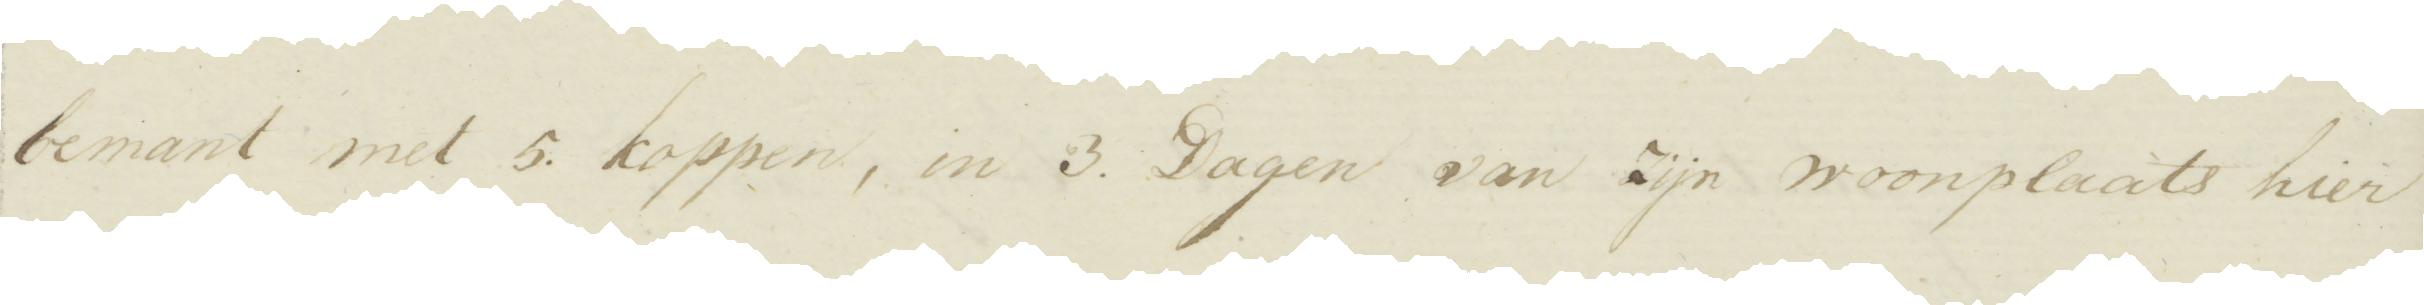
bemant met 5. koppen, in 3. Dagen van zijn woonplaats hier
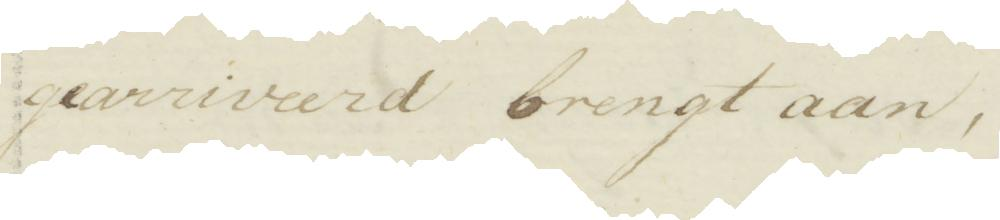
gearriveerd brengt aan,
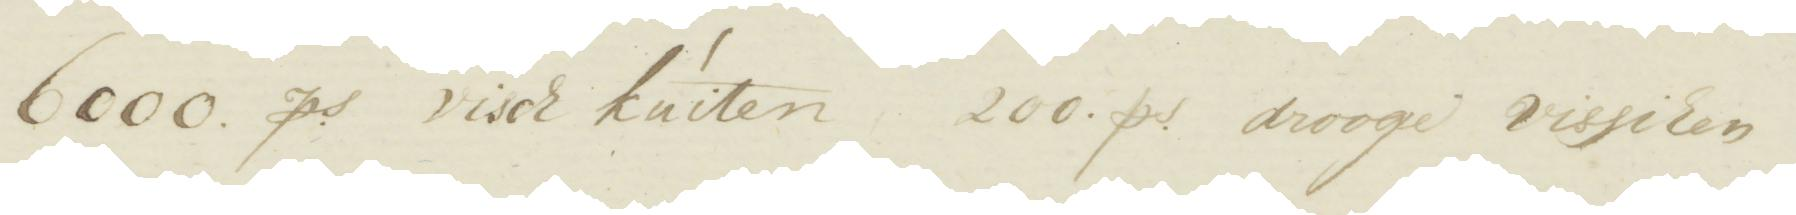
6000. p.s visch kuiten 200. p.s drooge visschen
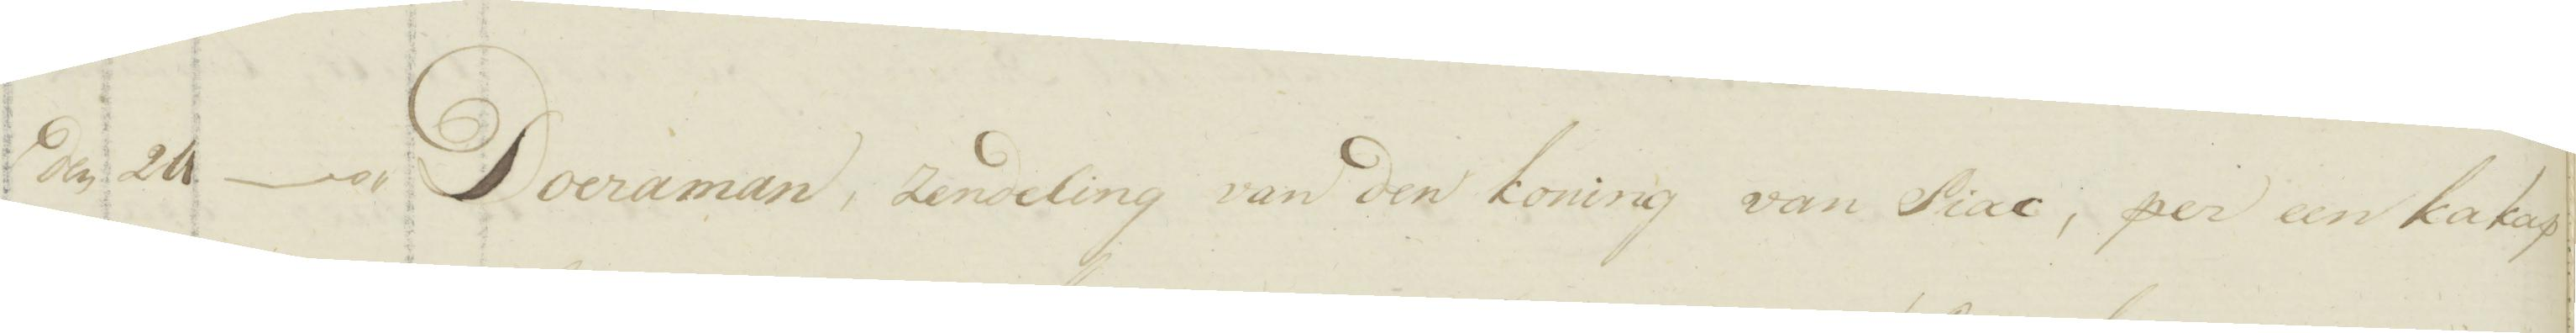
den 24 _„o Doeraman, zendeling van den koning van siac, per een kakap
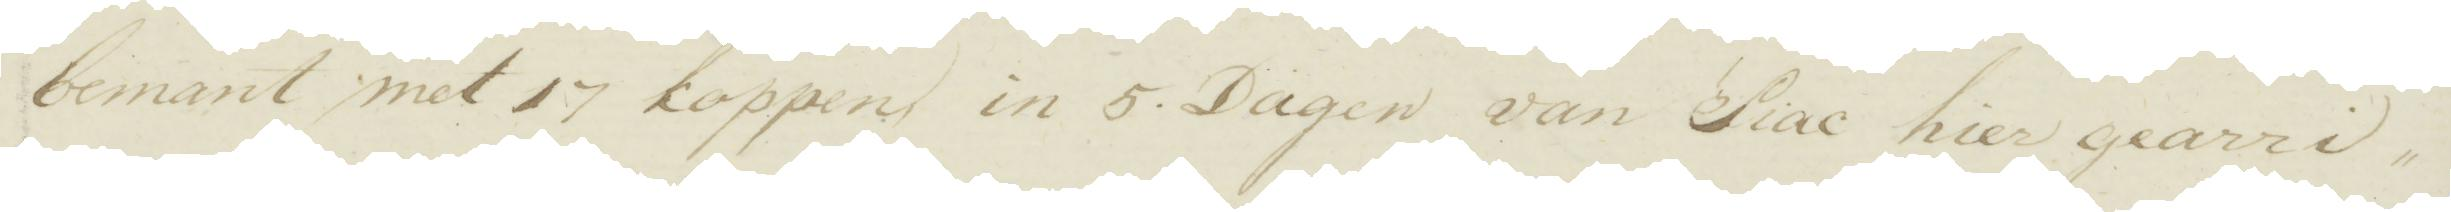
bemant met 17 koppen, in 5. Dagen van Siac hier gearri„
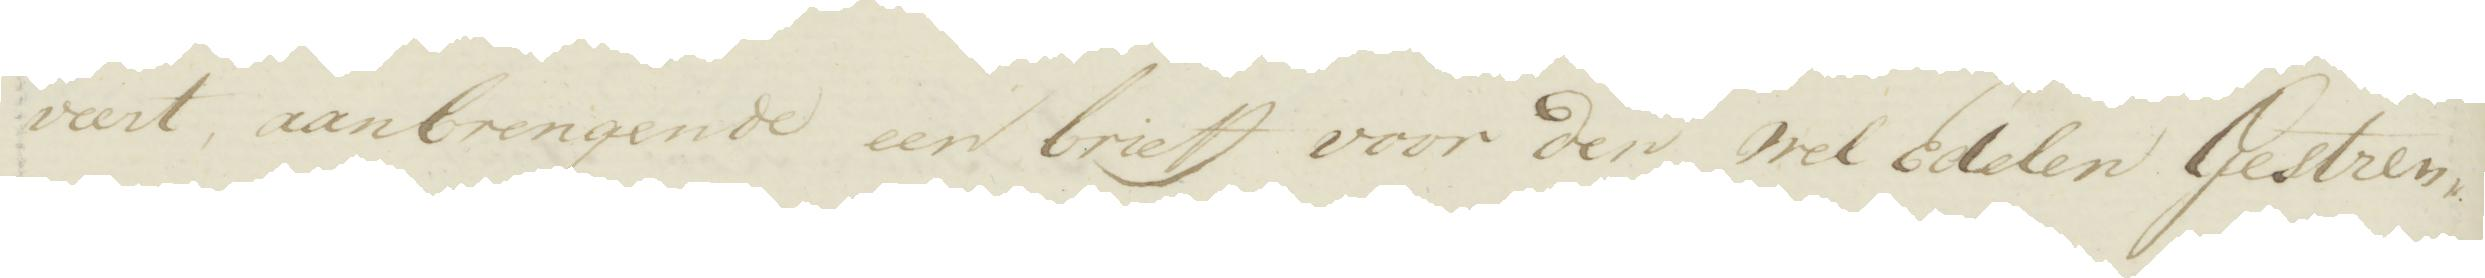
veert, aanbrengende een brieff voor den wel Edelen Gestren„
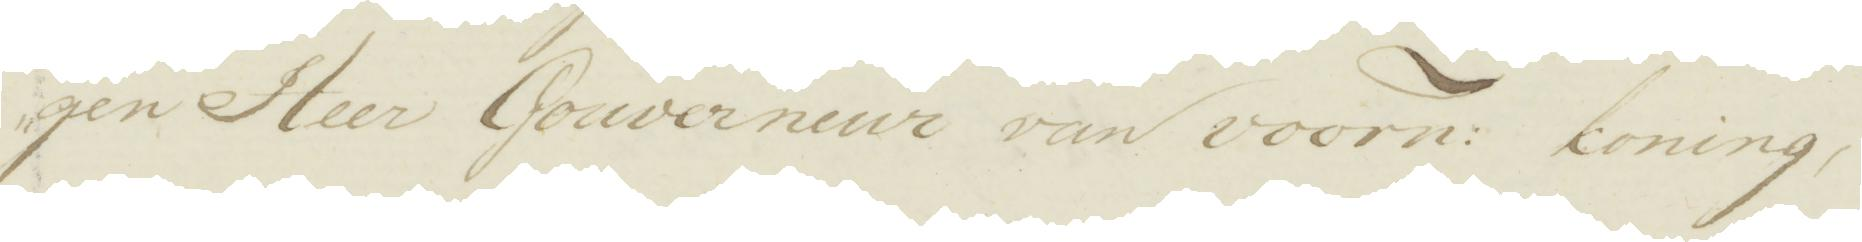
„gen Heer Gouverneur van voorn: koning,
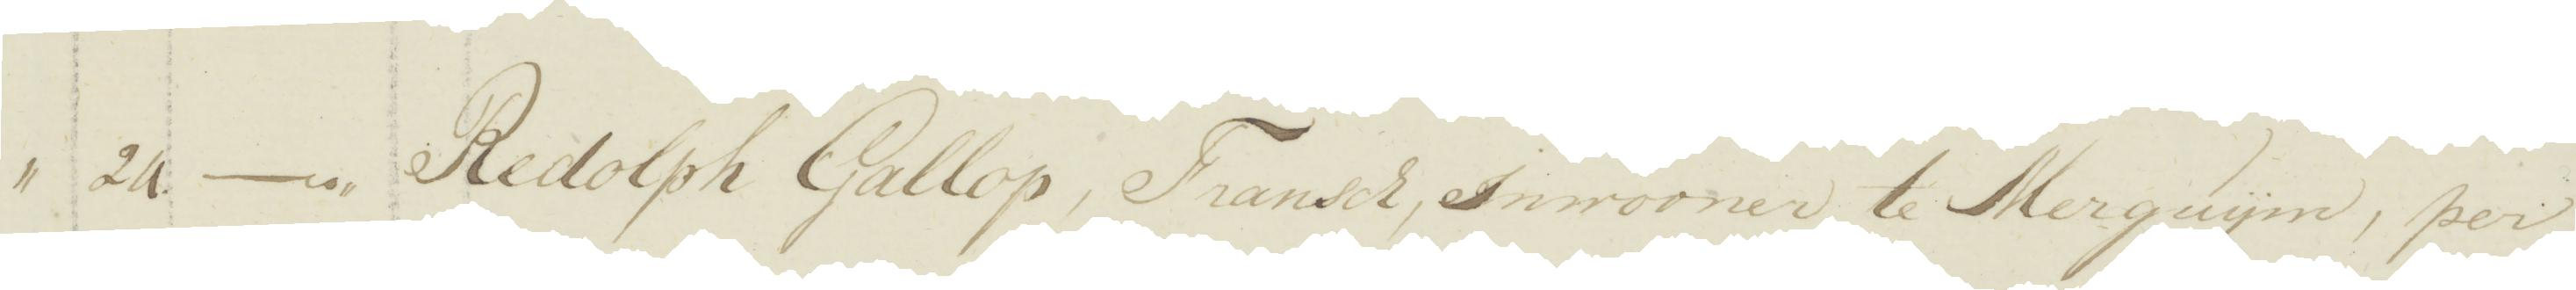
„ 24. _„o Redolph Gallop, Fransch, Jnwooner te Merguijm, per
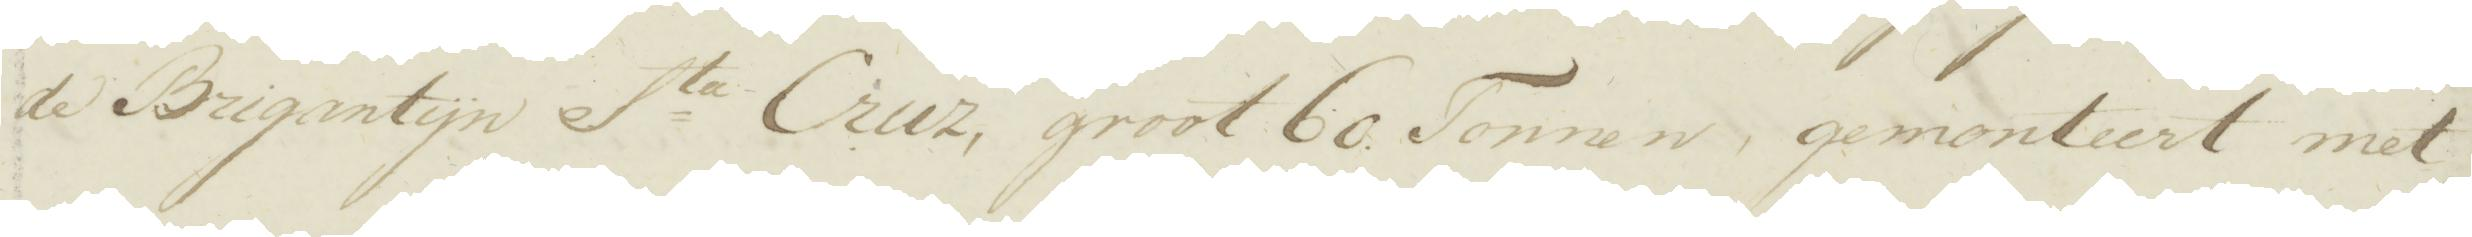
de Brigantijn S=ta Cruz, groot 60. Tonnen gemonteert met
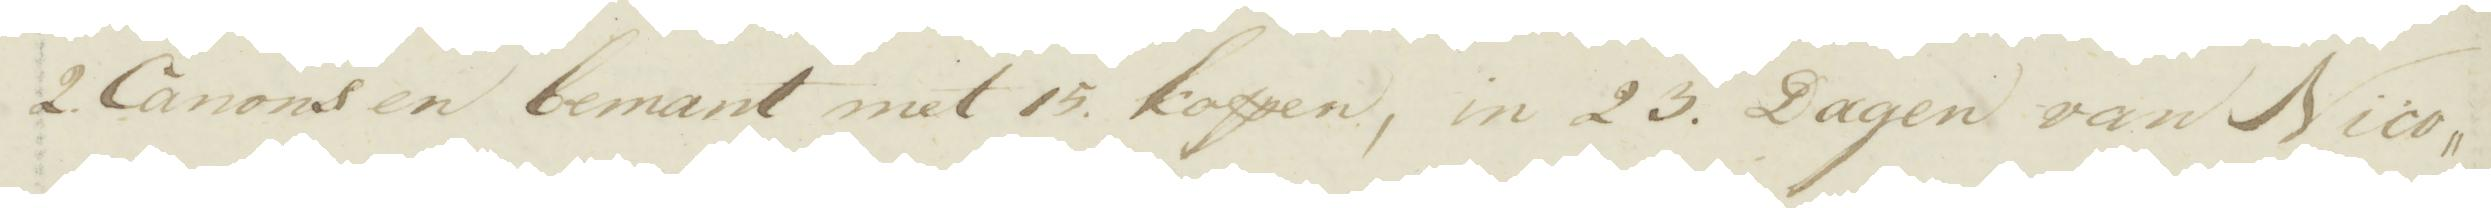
2 Canons en bemant met 15. koppen, in 23. Dagen van Nico„
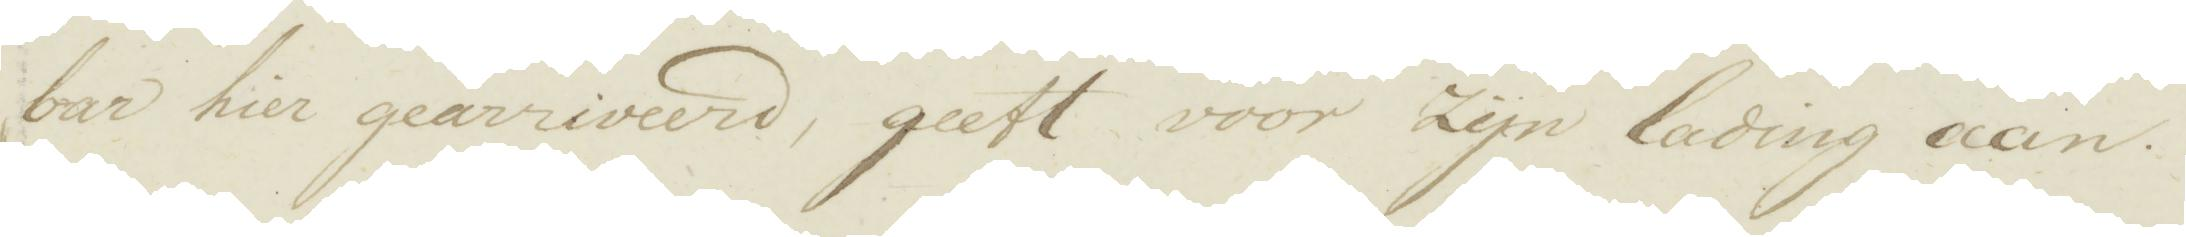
bar hier gearriveerd, geeft voor zijn lading aan.
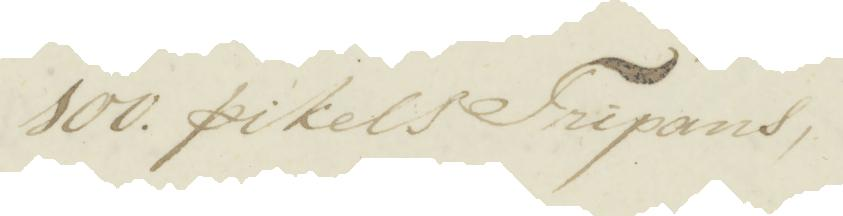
100. pikels Tripans,
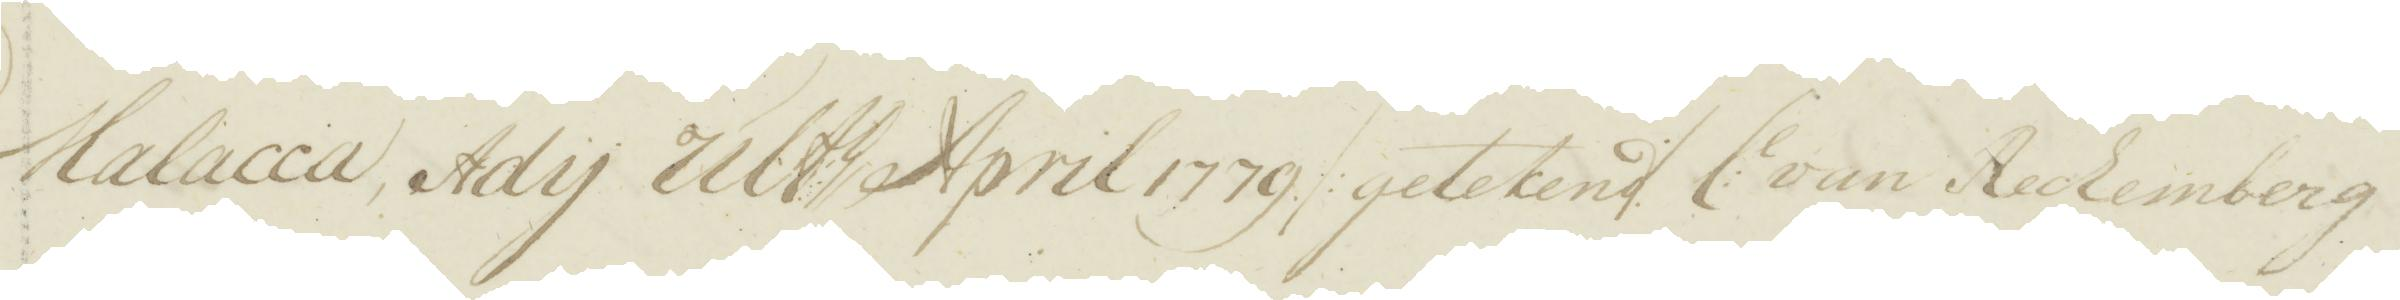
Malacca, Adij ult„o April 1779 /:getekend/ C:l van Rechemberg
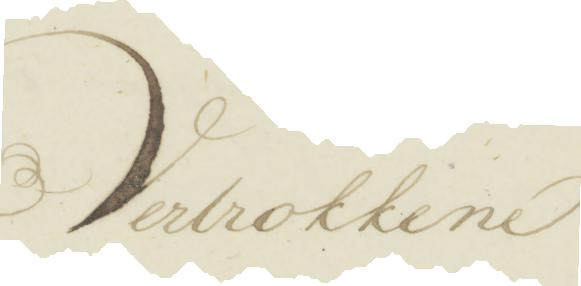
Vertrokkene
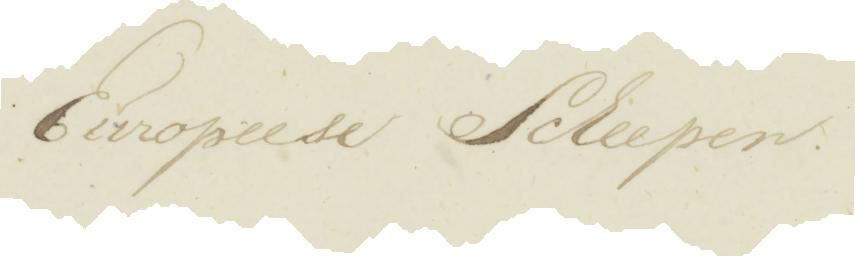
Europeese Scheepen.
